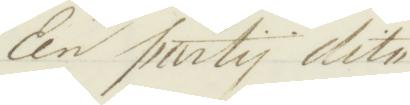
Een partij dito
